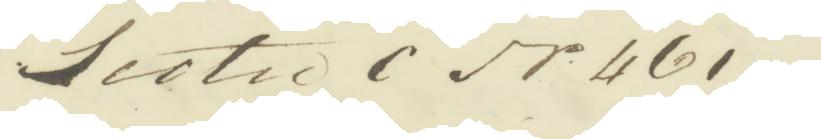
Sectie C N.o 461 -
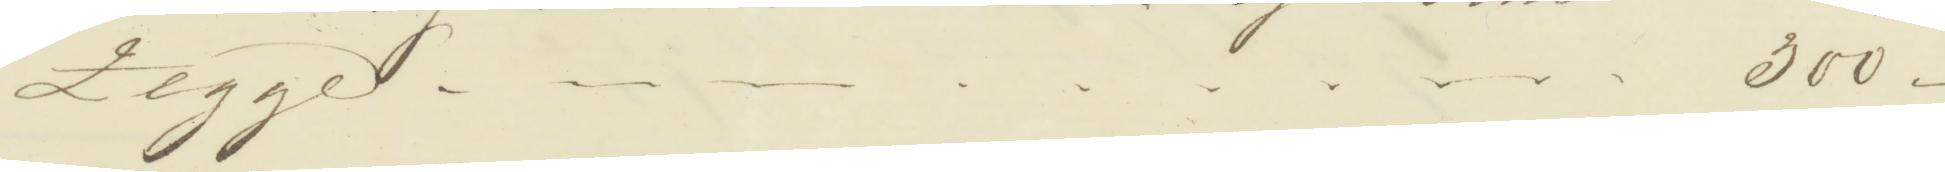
Zegge - - - - - . . . . - - . 300-
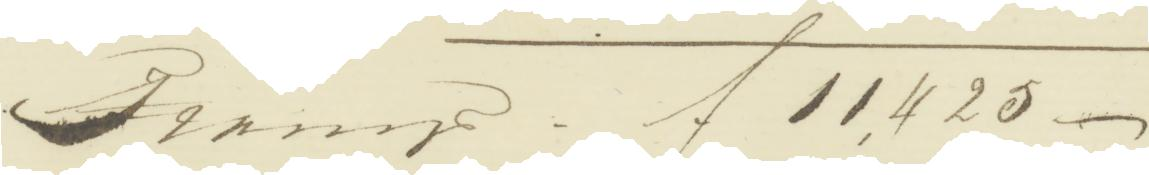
Transp - ƒ 11,425—
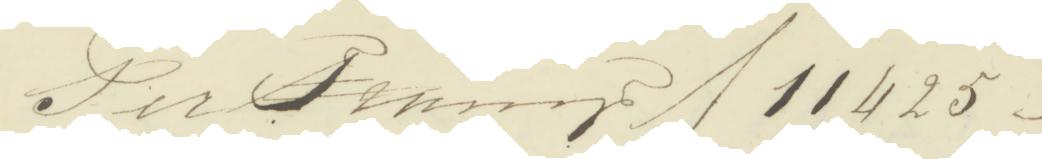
Per Transp ƒ 11425-
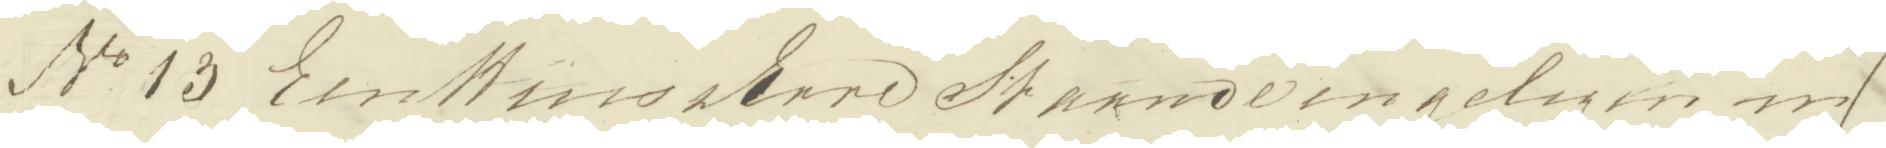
N.o 13 Een Huis en Erve staande en gelegen in
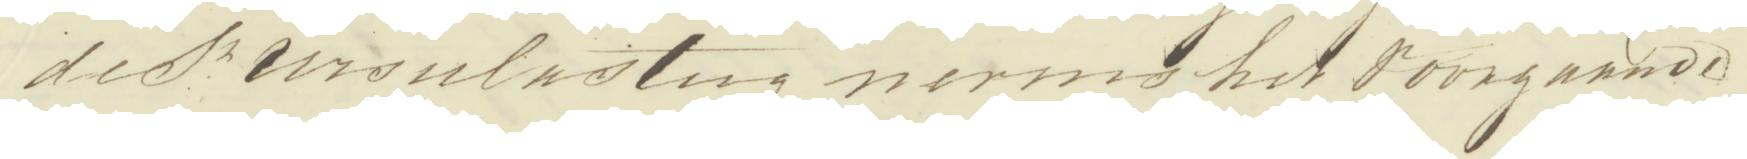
de S:t Ursulasteeg nevens het voorgaande
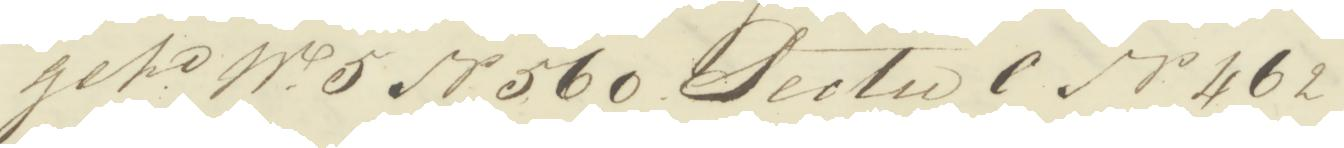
get:d W. 5 No 560 Sectie C No 462
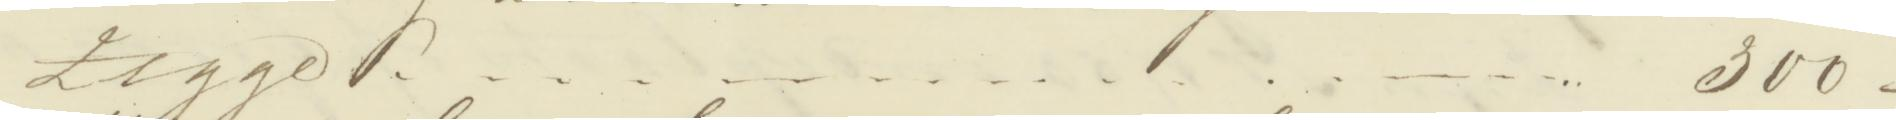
zegge . . . . . . - - - - . . . . - - - .. 300
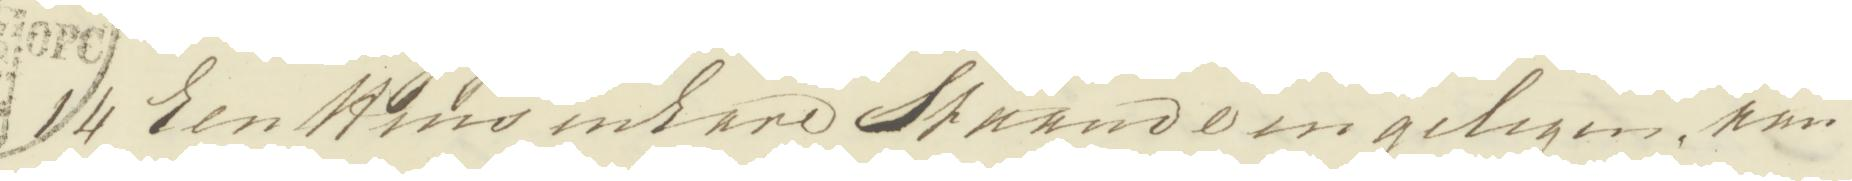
14 Een Huis en Erve staande en gelegen, aan
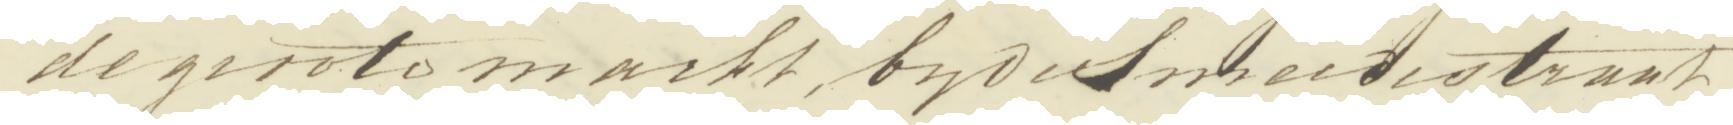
de grote markt, bij de Smeedestraat
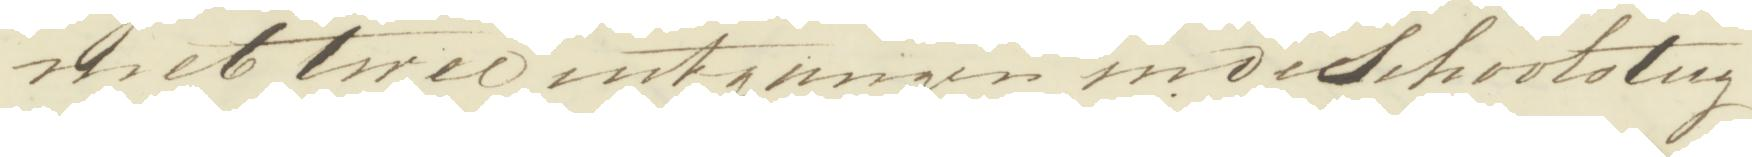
met twee ingangen in de Schoolsteeg
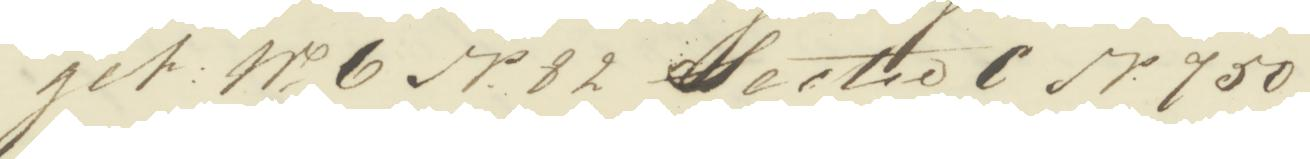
get: W 6 N.o 82 Sectie C N.o 750
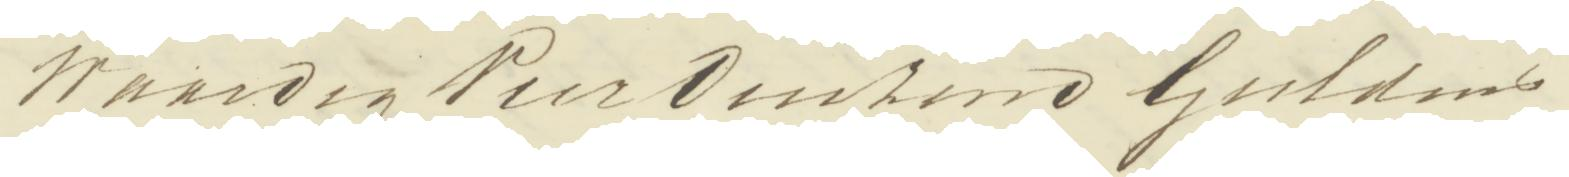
Waardig Vier duizend Guldens
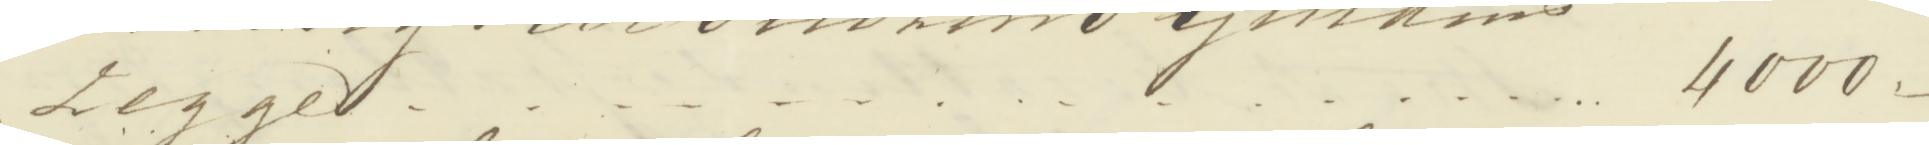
zegge . . . - - - - . . . . . . . . . . .. 4000.
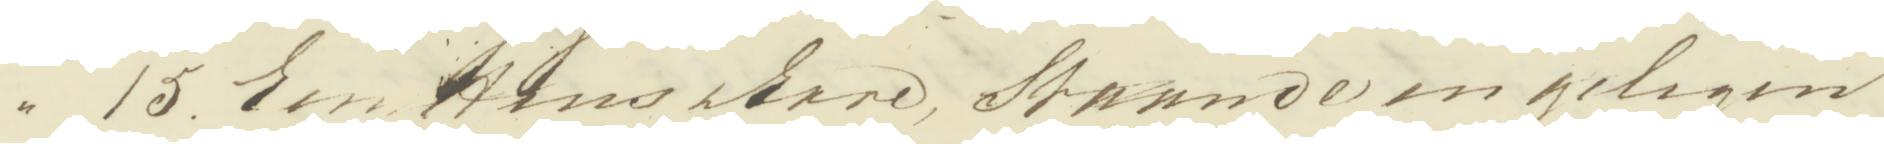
„ 15. Een Huis en Erve, staande en gelegen
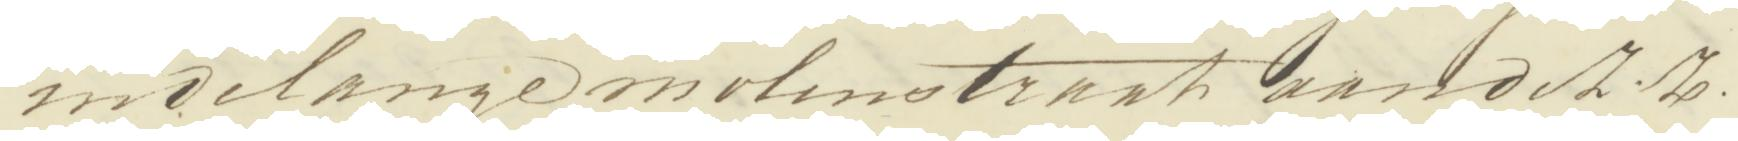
in de lange molenstraat aan de Z.Z.
